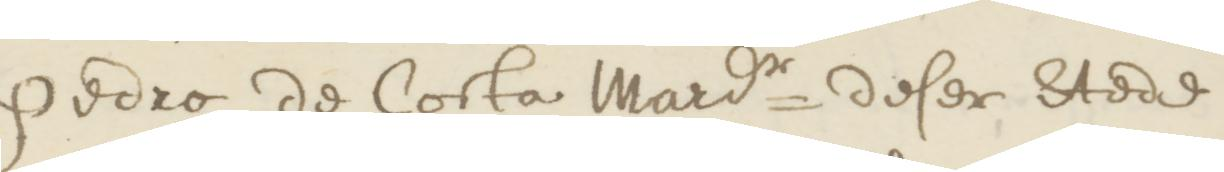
pedro de Costa Mard=r deser stede
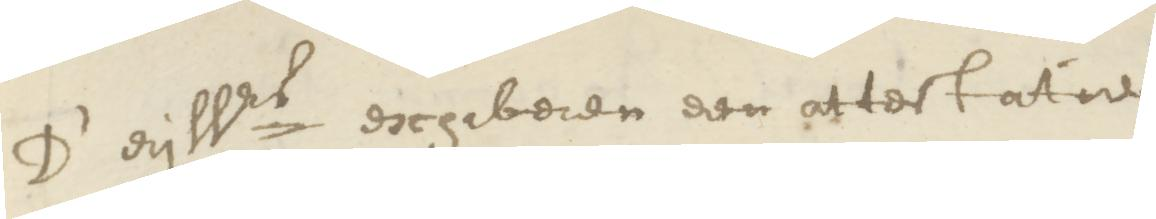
D' eijss=rs exhiberen den attestatie
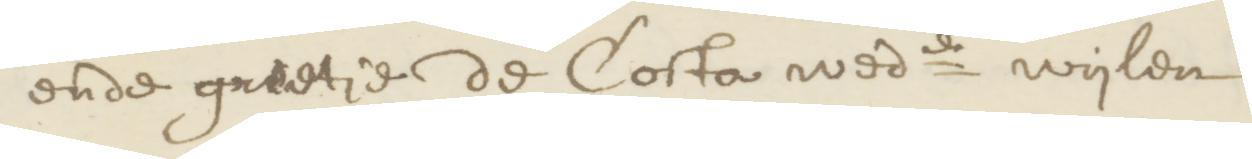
ende grietje de Costa wed=e wijlen
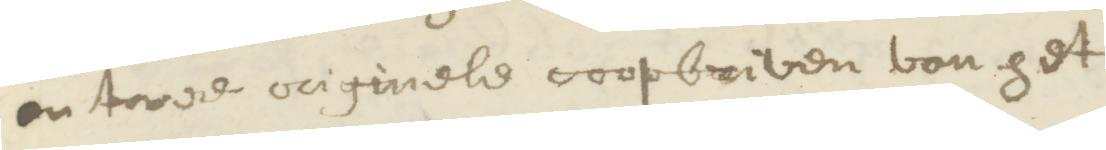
en twee originele coopbriven van het
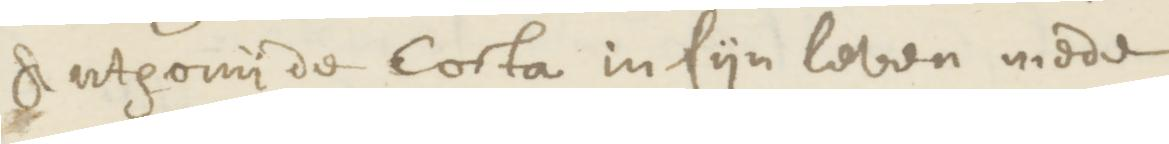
Anthonij de Costa in sijn leven mede
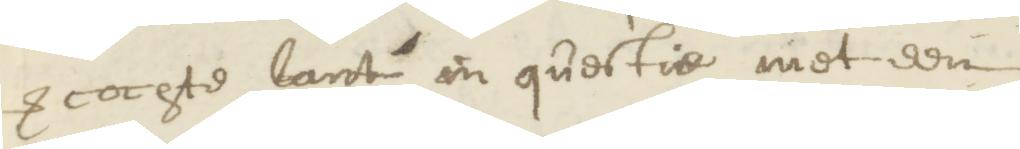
vercochte lant in questie met een
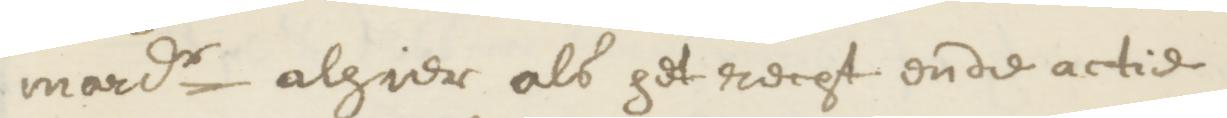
mard=r alhier als het recht ende actie
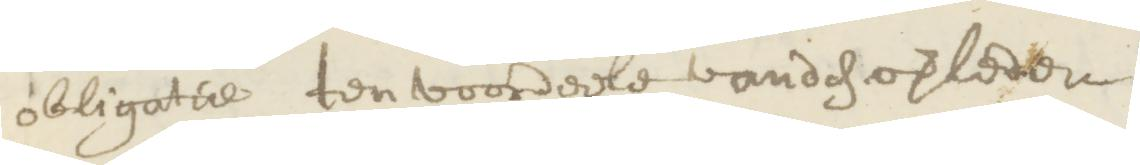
obligatie ten voordeele vanden overleden
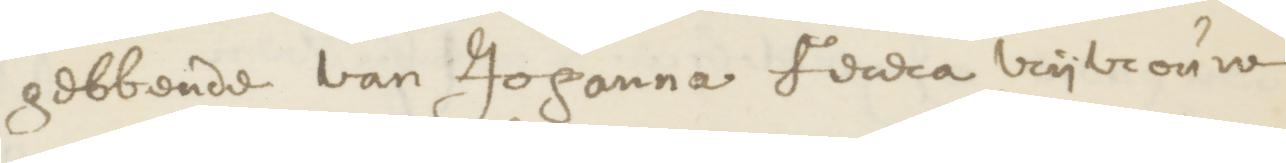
hebbende van Johanna ferera vrijvrouw
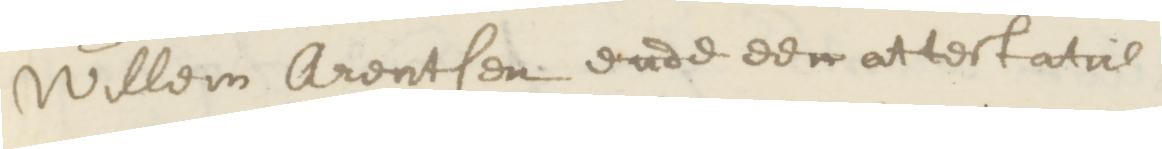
Willem Arentsen ende een attestatie
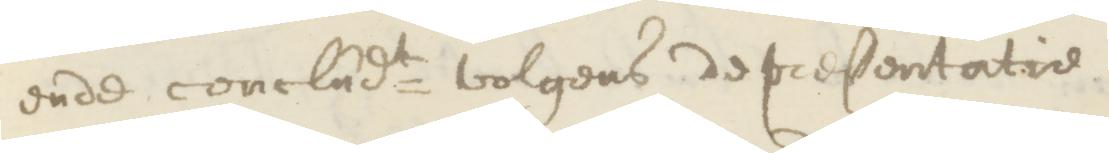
ende conclud=t volgens de presentatie
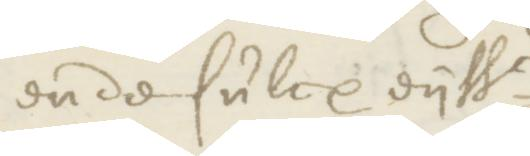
en de sulcx eijss=re
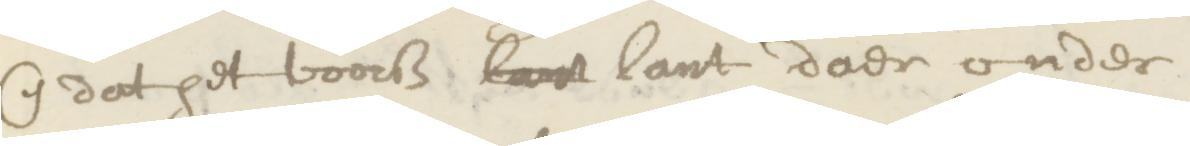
dat het voorsz lant lant daer onder
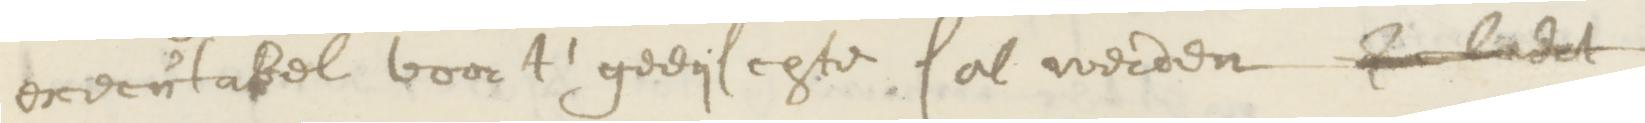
execusabel voor t' geeijschte sal werden verclaert
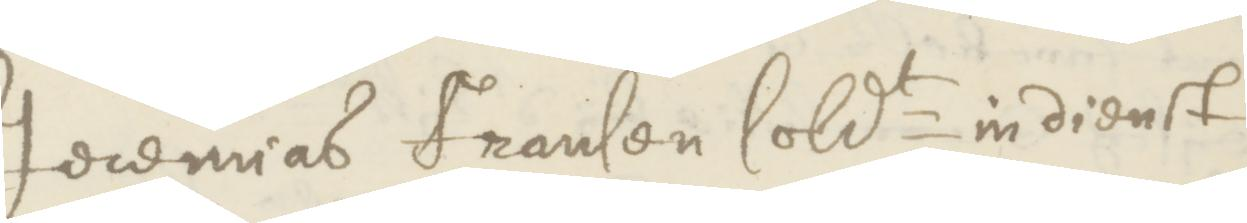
Jeremias Fransen sold=t in dienst
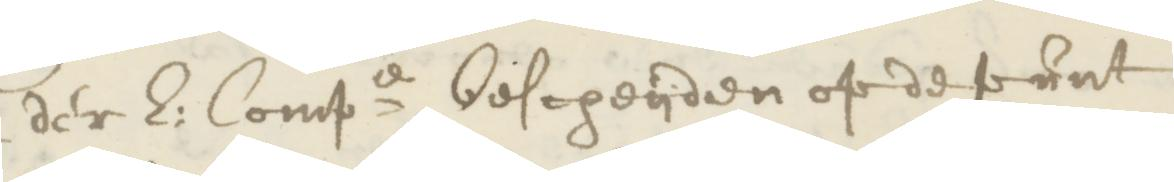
der E: Comp=e bescheijden op de punt
